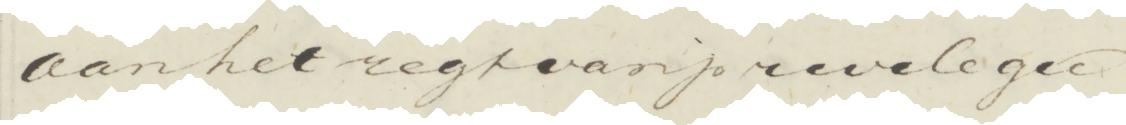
aan het regt van privilegie
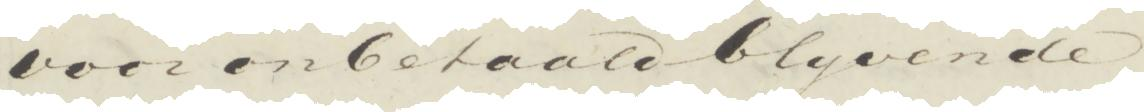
voor in betaald blyvende
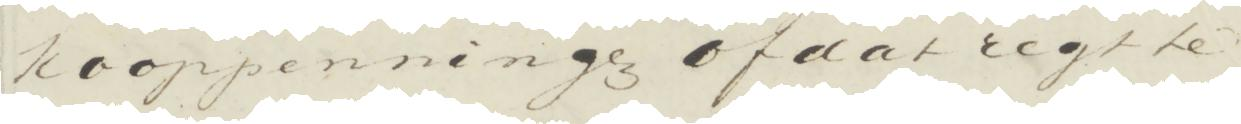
kooppenningen of dat regt te
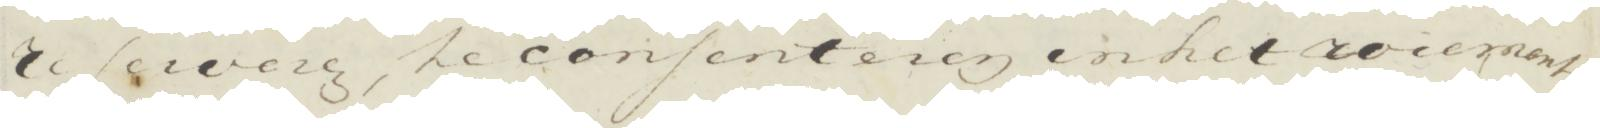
reserveren, te consenteren in het roiement,
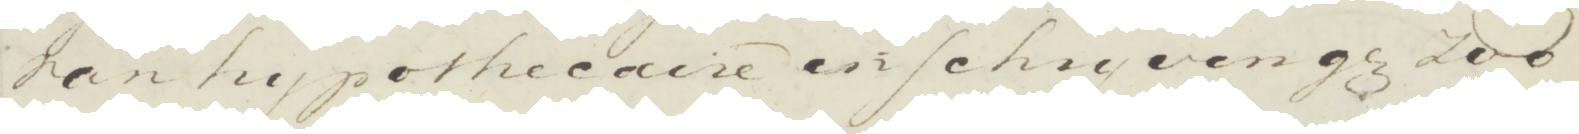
van hypothecaire inschryvingen zoo
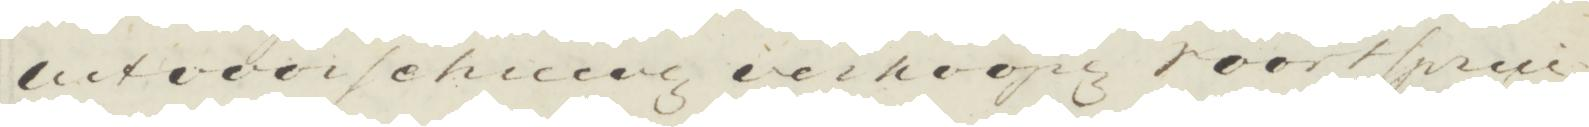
uit voorschreeven verkoopen voortsprui
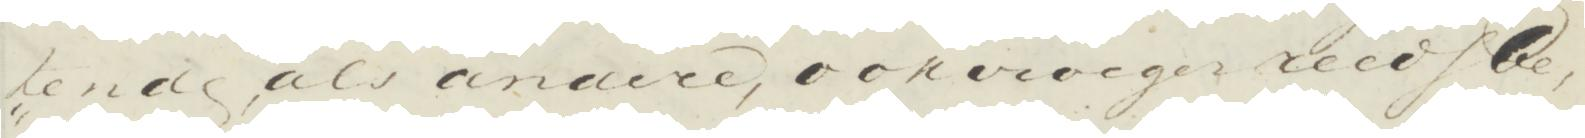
„tende, als andere, ook vroeger reeds be,
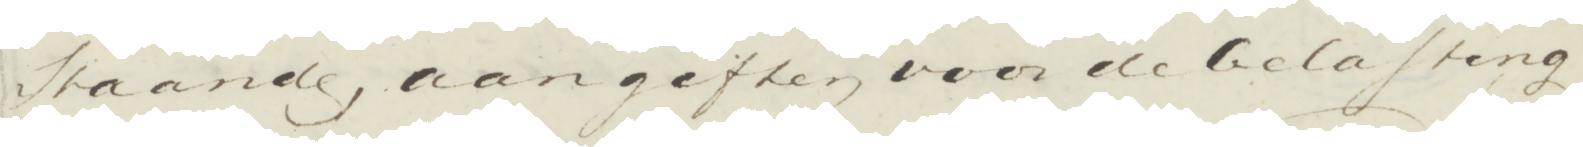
„staande, aangiften voor de belasting
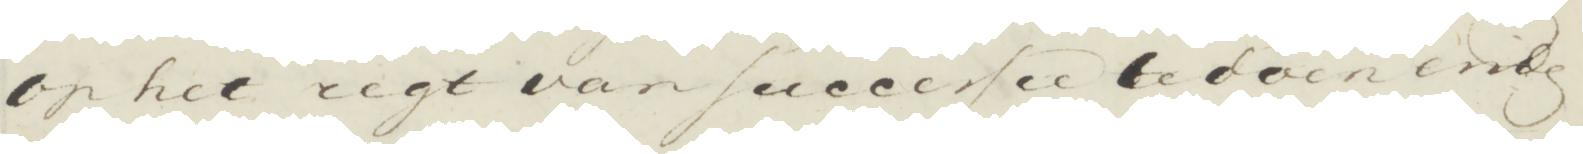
op het regt van successie te doen ende
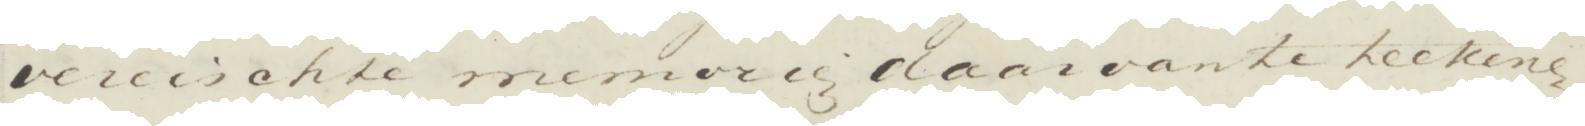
vereischte memorien daar van te teekenen
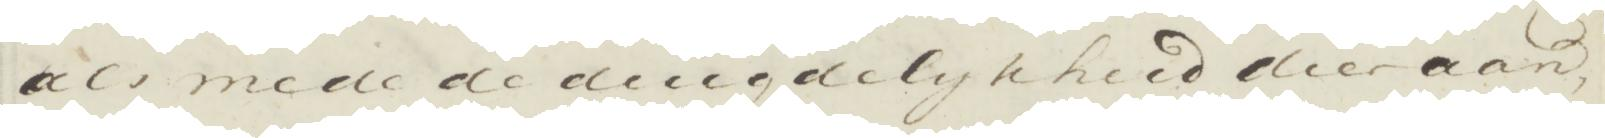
als mede de deugdelykheid dier aan,
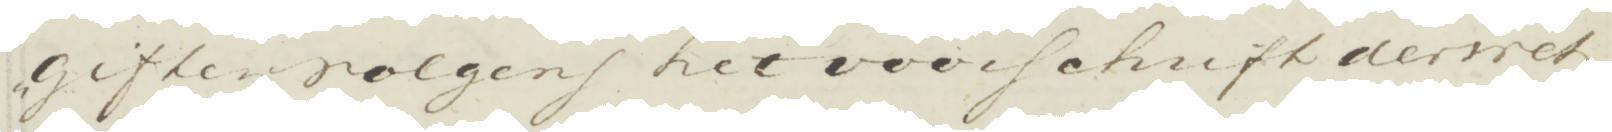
„giften volgens het voorschrift der wet
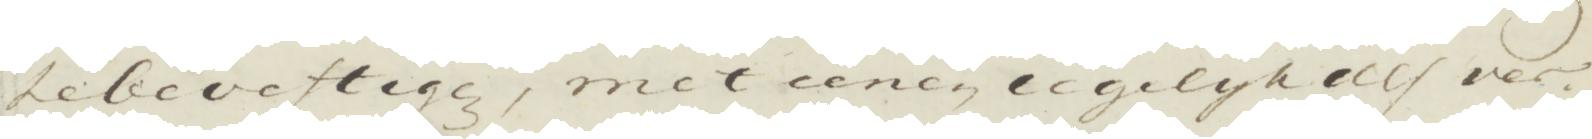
te bevestigen, met eenen iegelyk des ver,
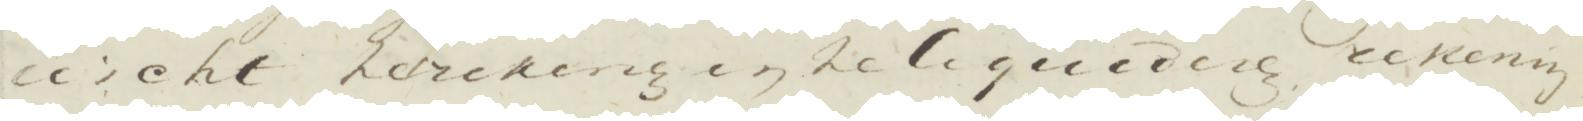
eischt te rekenen en te liquideren rekenin
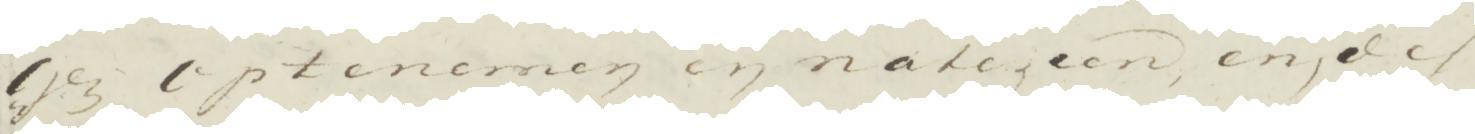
gen op te nemen en na te zien, en, des
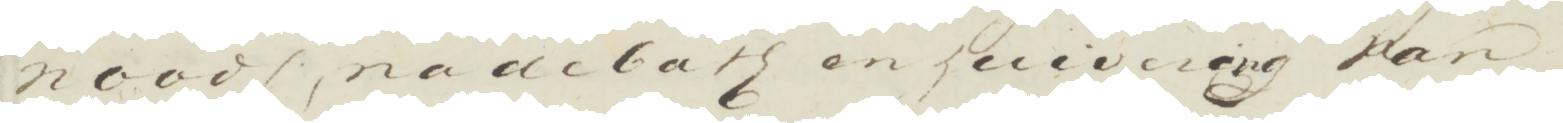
noods, na de baten en zuivering van
